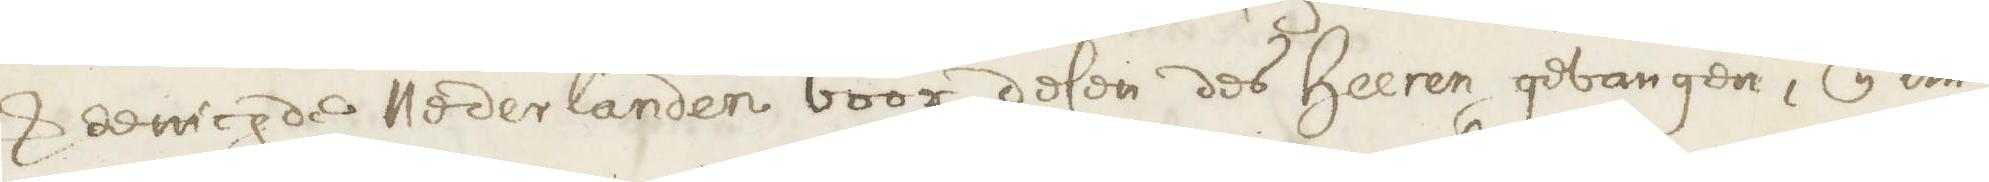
vereenichde Nederlanden voor desen des Heeren gevangen, ende nu
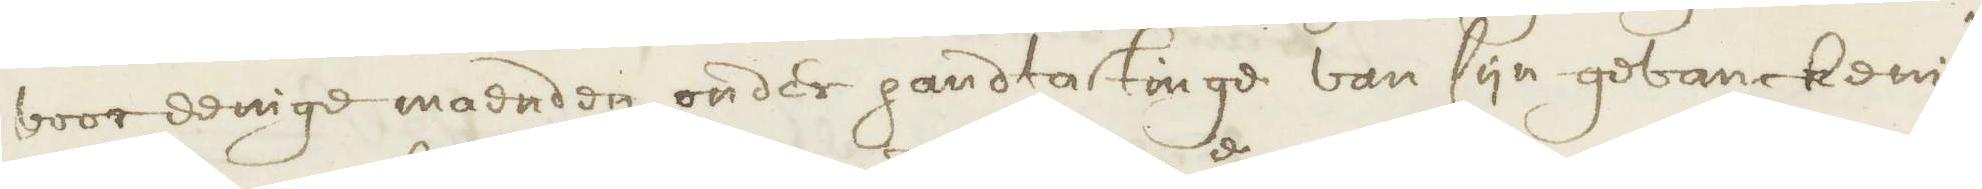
voor eenige maenden onder handtastinge van sijn gevanckenis
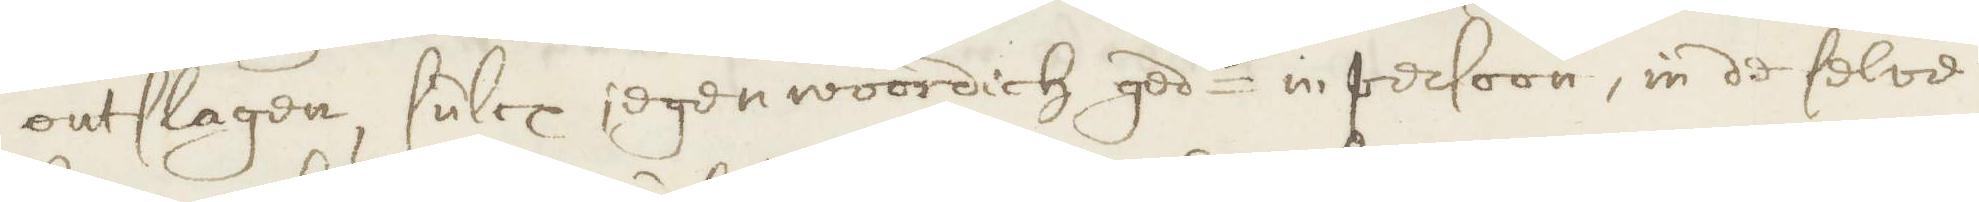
ontslagen, sulcx jegenwoordich ged=e in persoon, in de selve
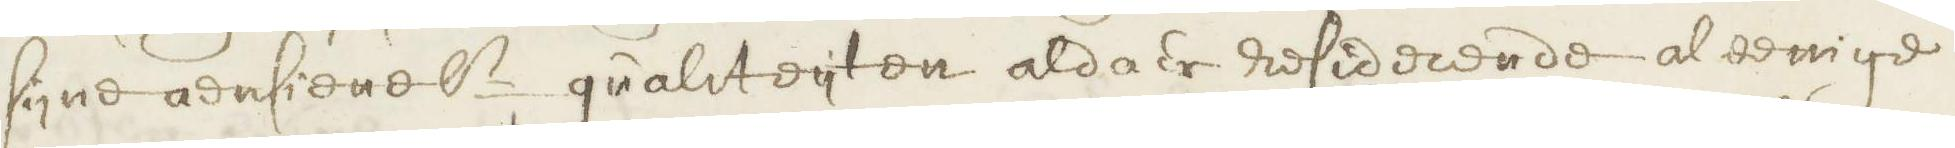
sijne aensienelijk qualiteijten aldaer residerende al eenige
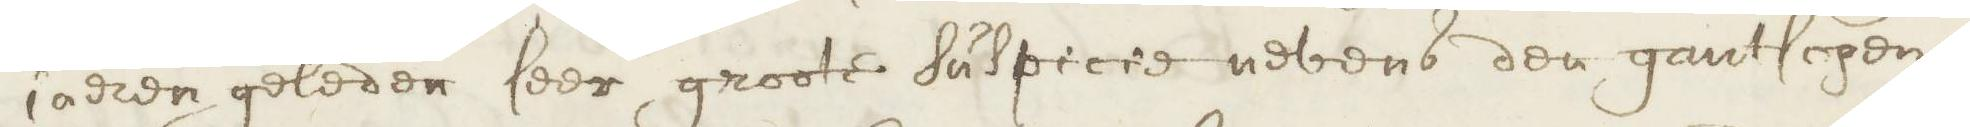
jaeren geleder seer groote suspicie nevens der gantschen
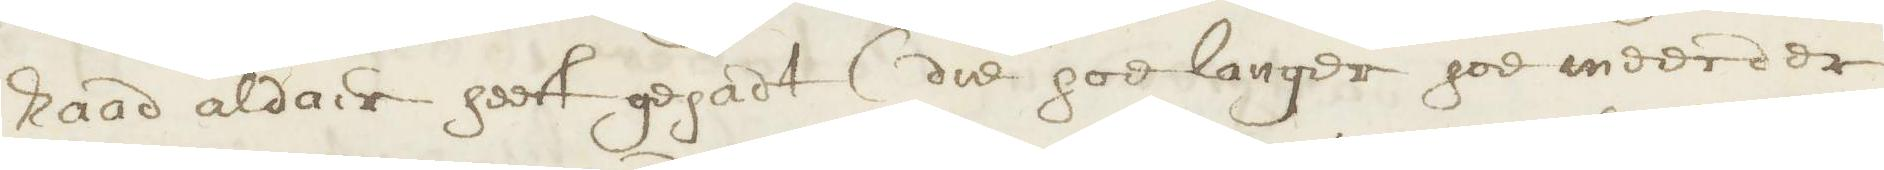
Raad aldaer heeft gehadt ( die hoe langer hoe meerder
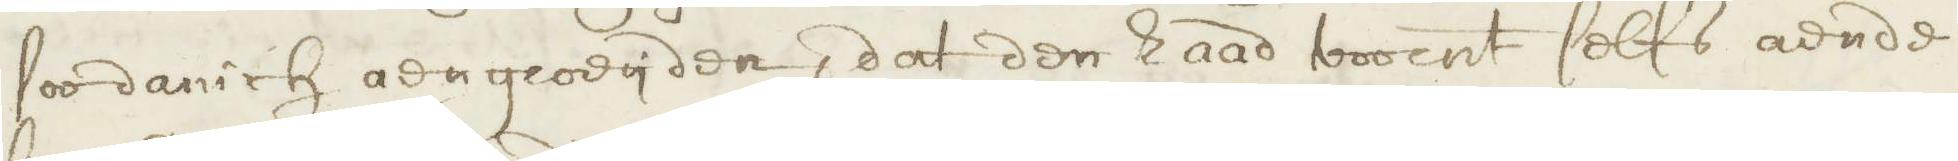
soodanich aengroeijden, dat den raad voornt selfs aende
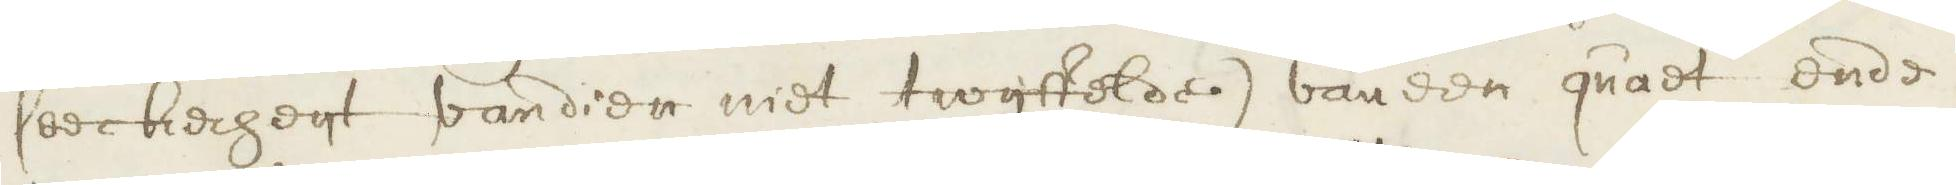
seeckerheyt vandien niet twijffelde) van een quaet ende
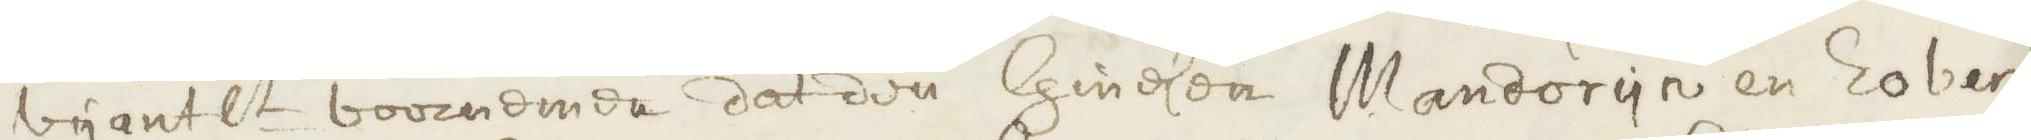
vijantlijk voornemen dat den Chinesen Mandorijn en rover
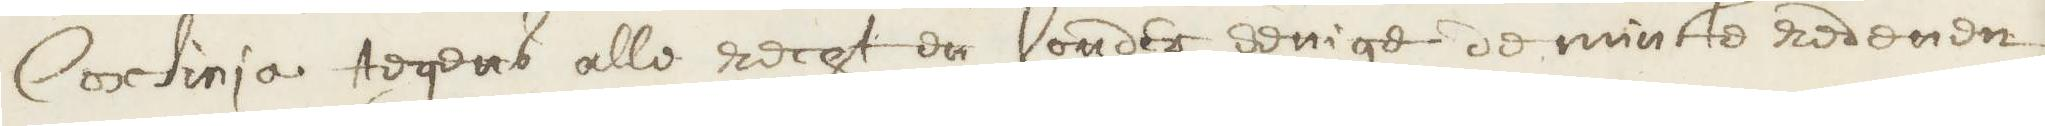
Coxsinja tegens alle recht en sonder eenige de minste redenen
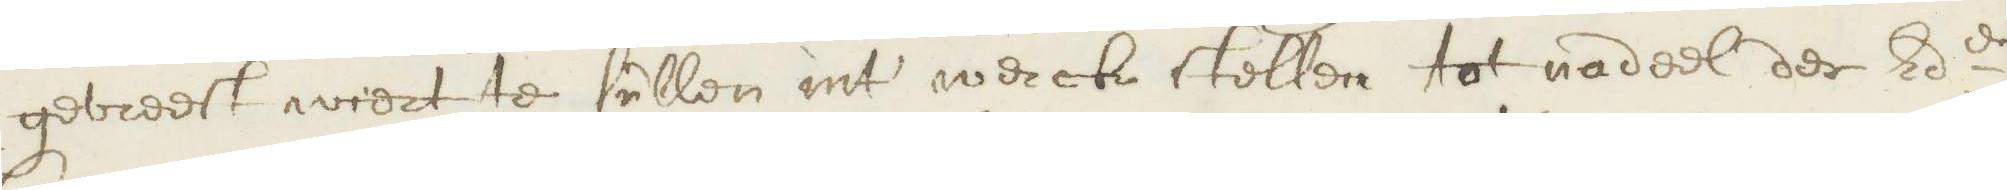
gevreest wiert te sullen int' werck stellen tot nadeel der Ed=e
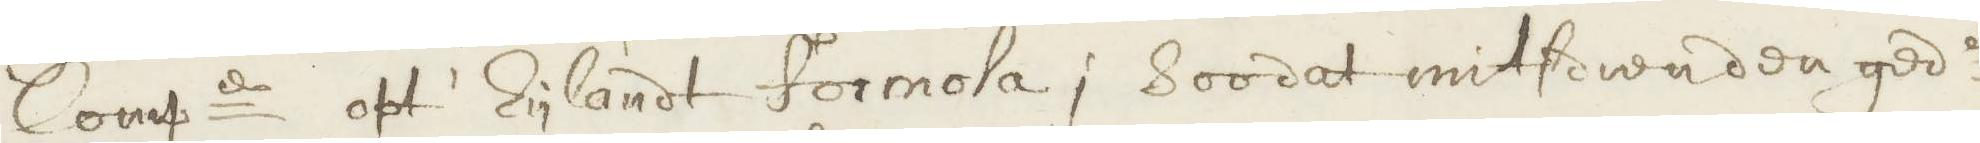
Comp=e opt' Eijlandt formosa; soodat mitsdien den ged=e
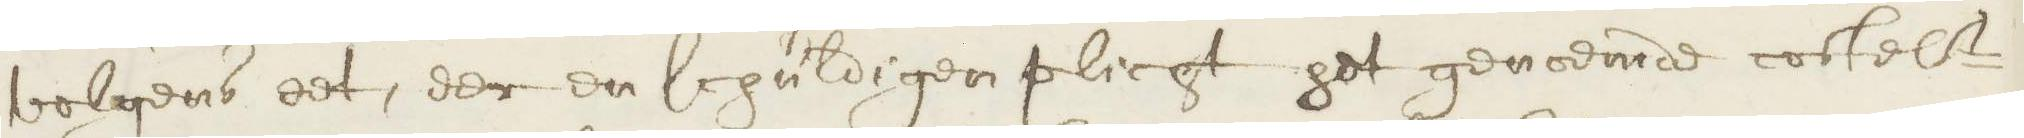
volgens eet, eer en schuldigen plicht tot genoemde costelijk
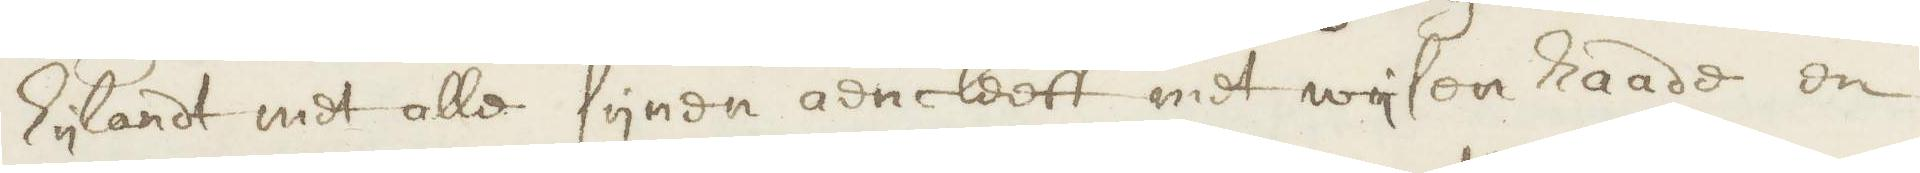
Eijlandt met alle sijnen aencleeft met wijsen Raade en
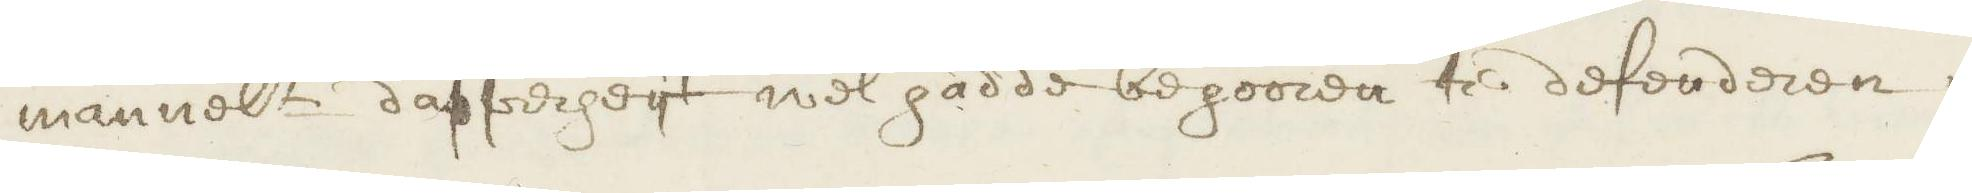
mannelijk dapperheijt wel hadde behooren te deserderen:
